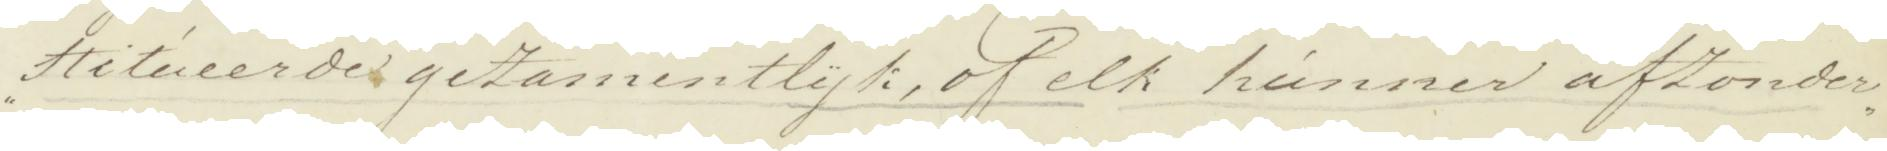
„stitueerde gezamentlijk, of elk hunner afzonder„
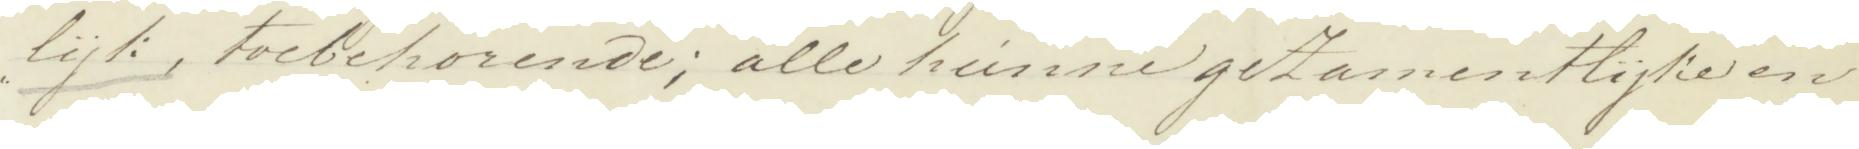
lijk, toebehorende; alle hunne gezamentlijke en
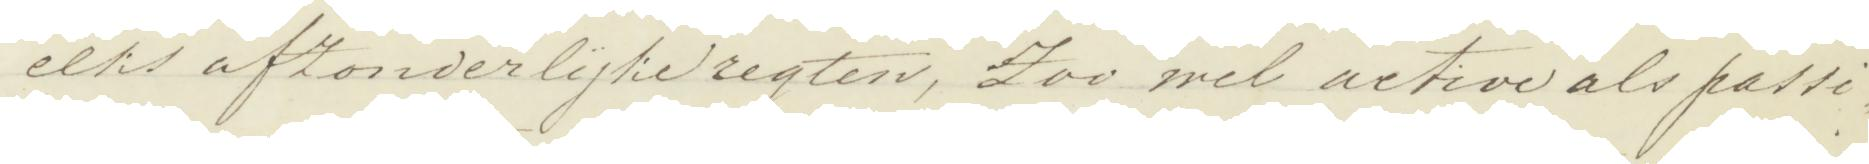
elks afzonderlijke regten, zoo wel active als passi
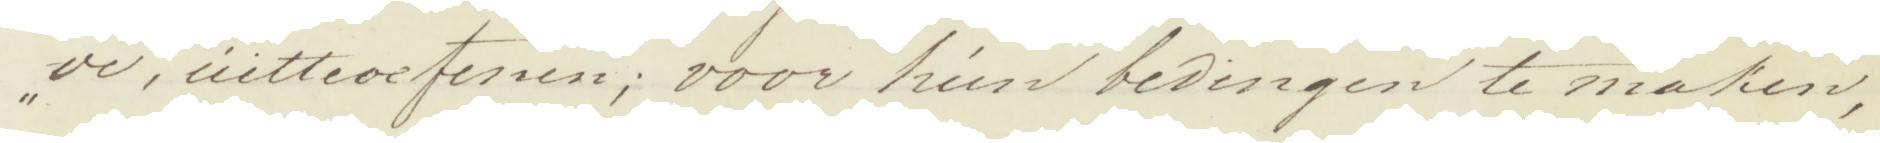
„ve, uitteoefenen; voor hun bedingen te maken,
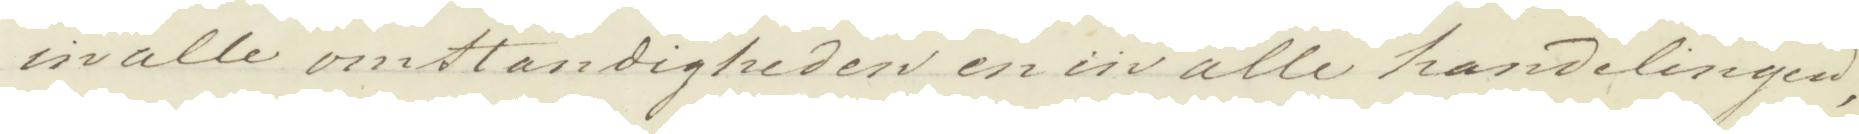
in alle omstandigheden en in alle handelingen,
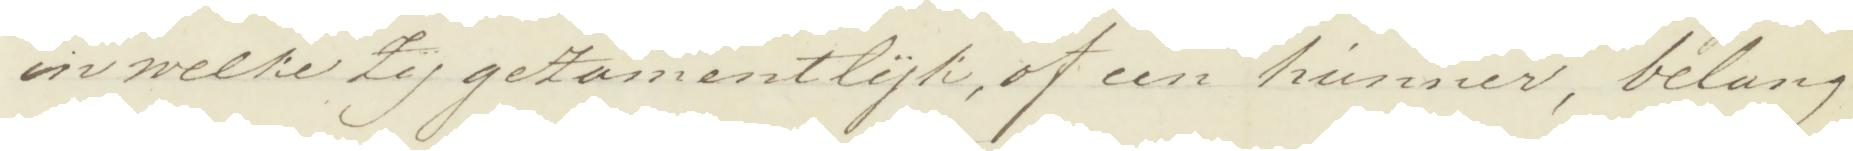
in welke zij gezamentlijk, of een hunner, belang
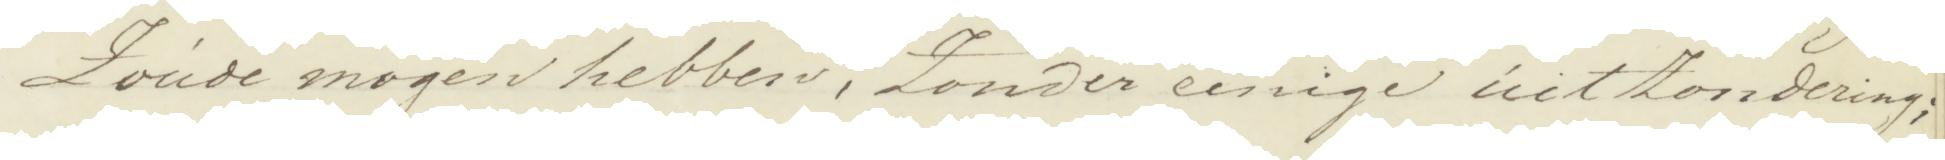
zoude mogen hebben, zonder eenige uitzondering;
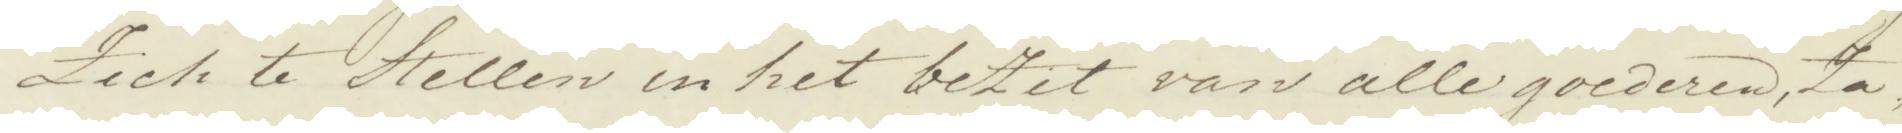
zich te stellen in het bezit van alle goederen, za
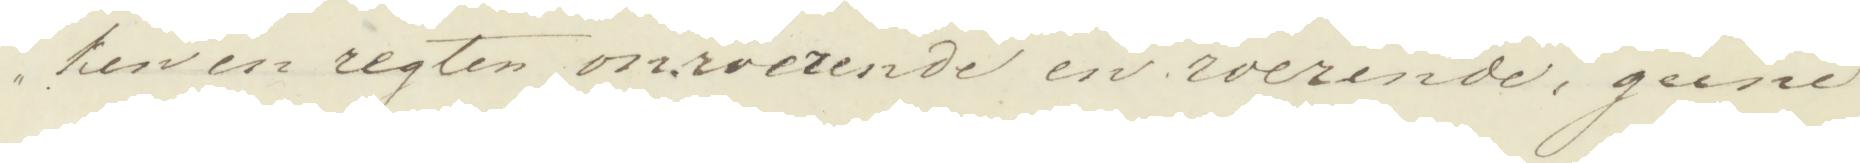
„ken en regten onroerende en roerende, geene
